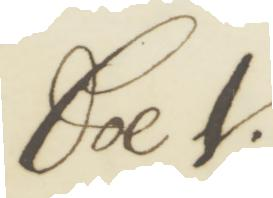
fol 1:
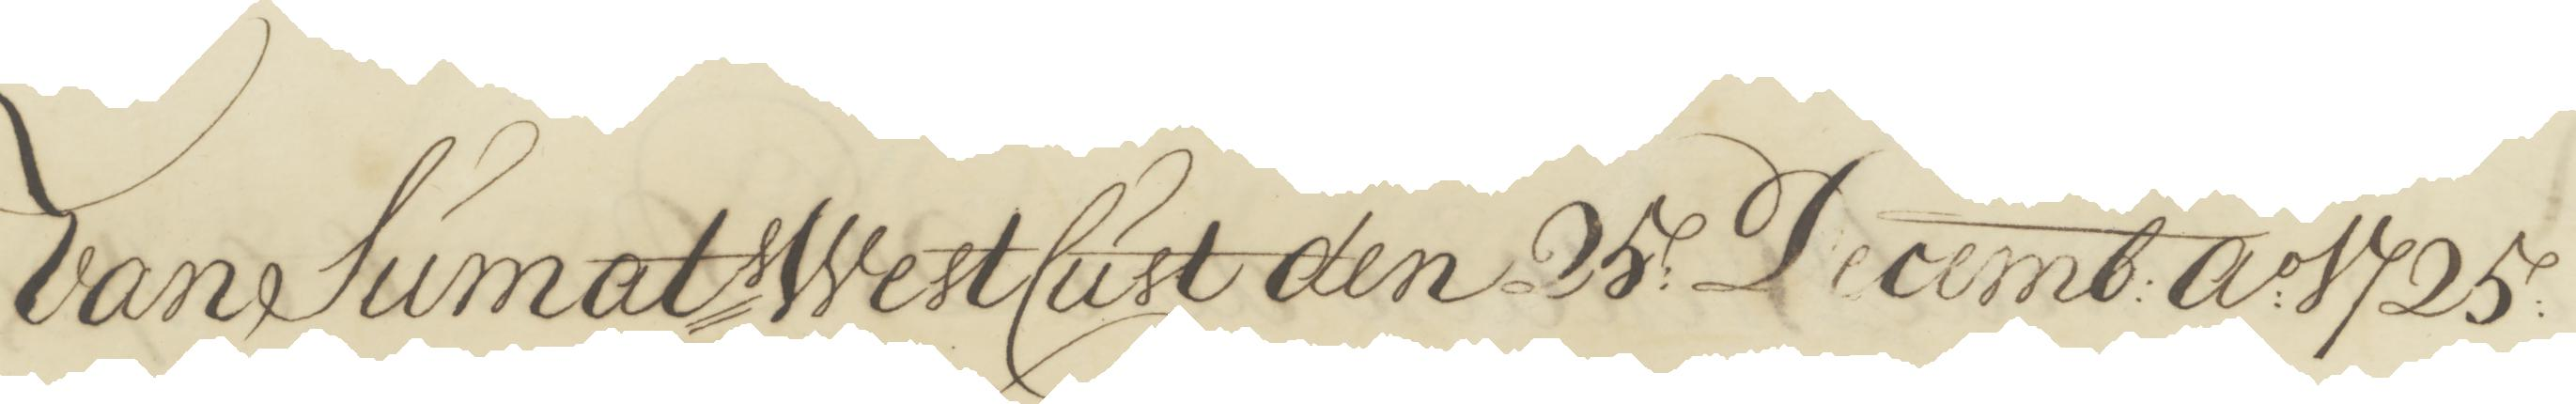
Van Sumat=s West Cust den 25: Decemb: A:o 1725:
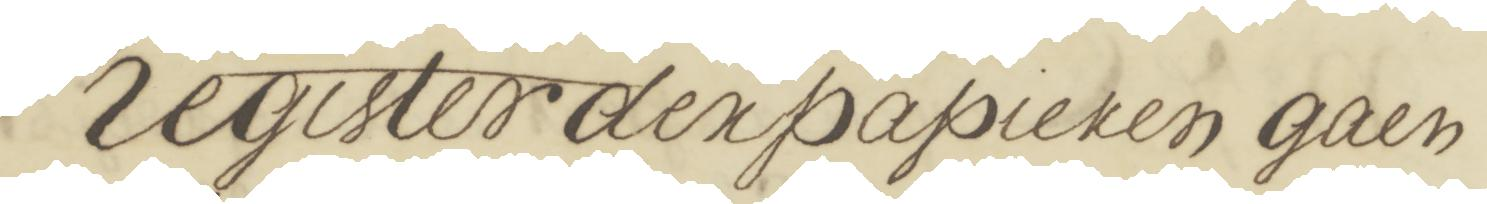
Register der papieren gaen
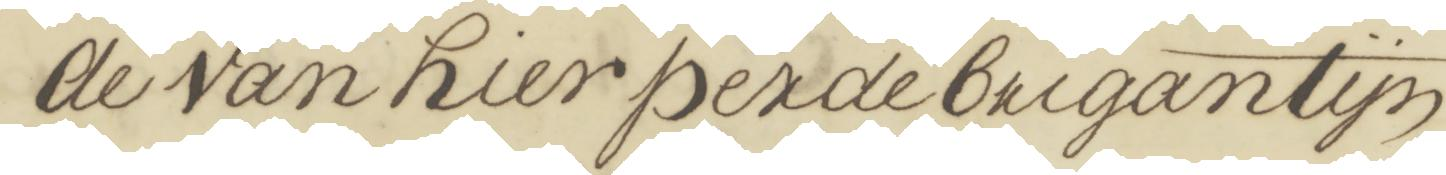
de van hier per de brigantijn
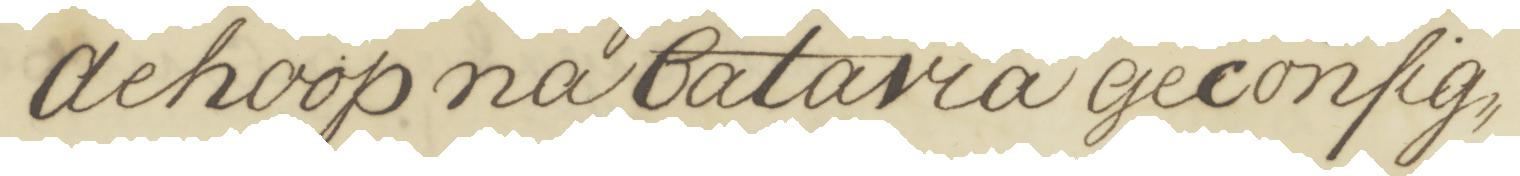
de hoop na batavia geconsig„
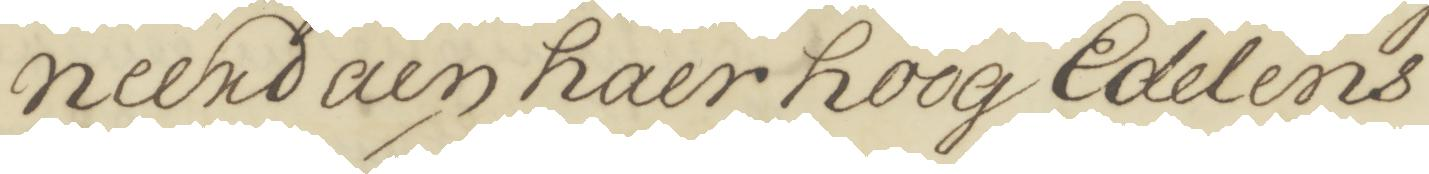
neerd aen haer hoog Edelens
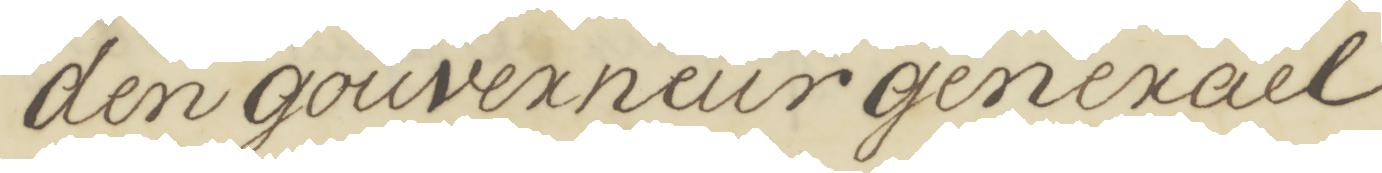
den gouverneur generael
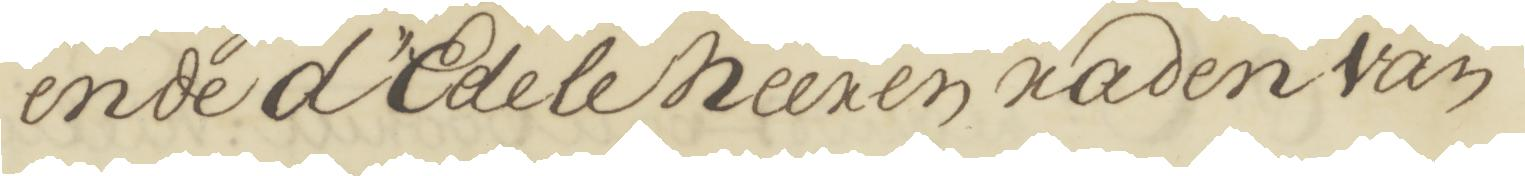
ende d'Edele heeren raden van
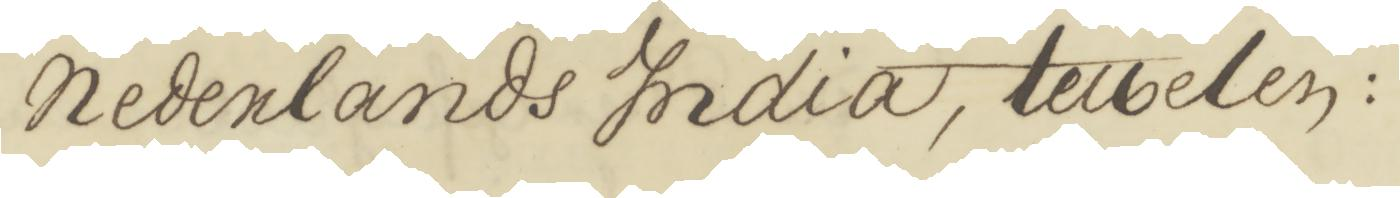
Nederlands India, teweten:
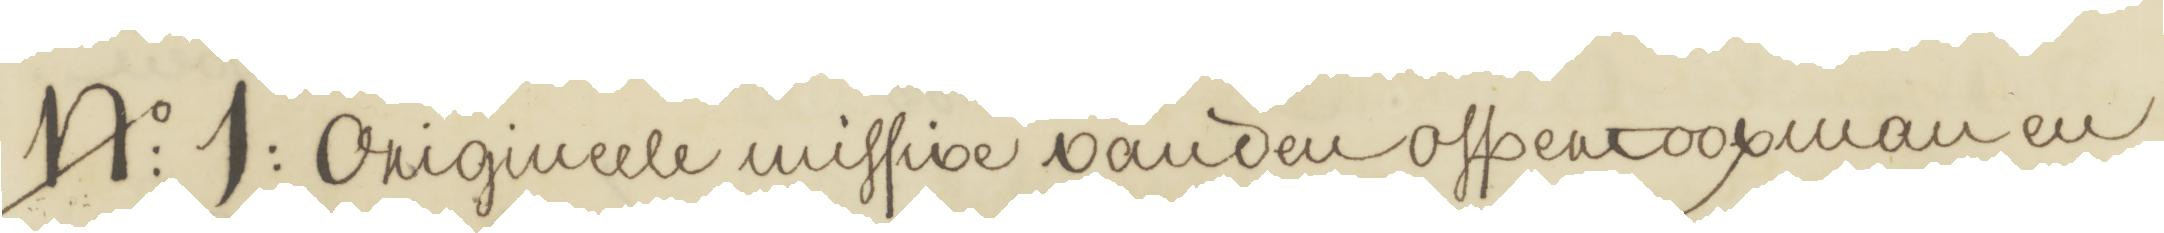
N:o 1: Origineele missive van den oppercoopman en
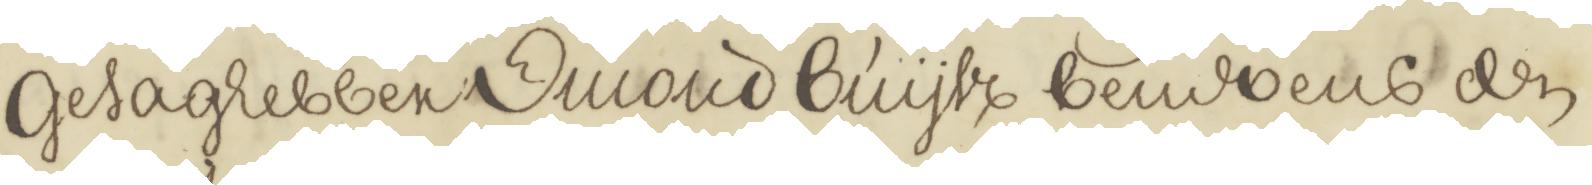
gesaghebber Emond buijk benevens den
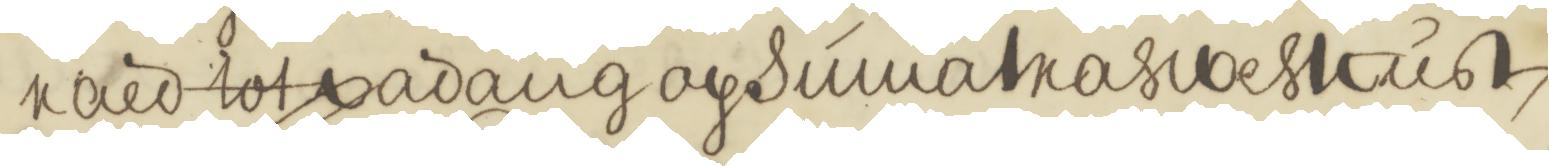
raed tot padang op Sumatras westcust
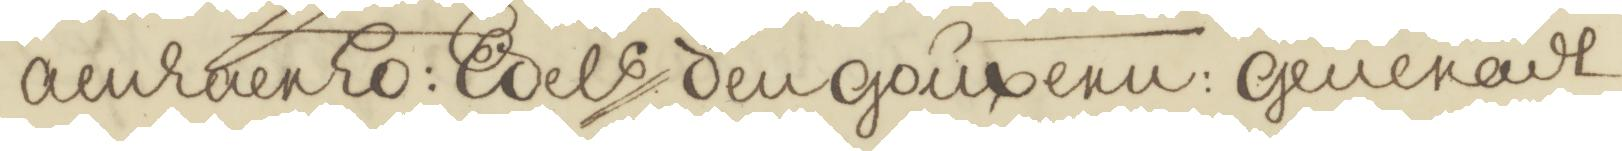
aen haer ho: Edel=s den gouvern: generael
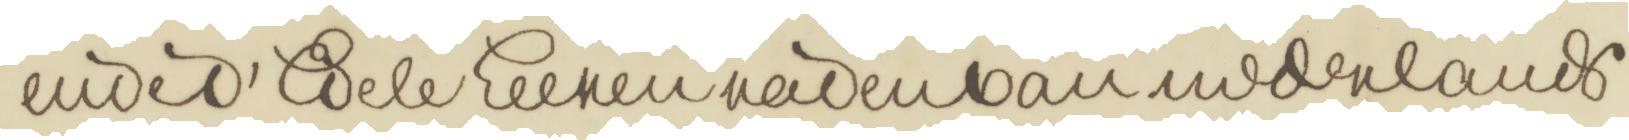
ende d’Edele neeren raden van nederlands
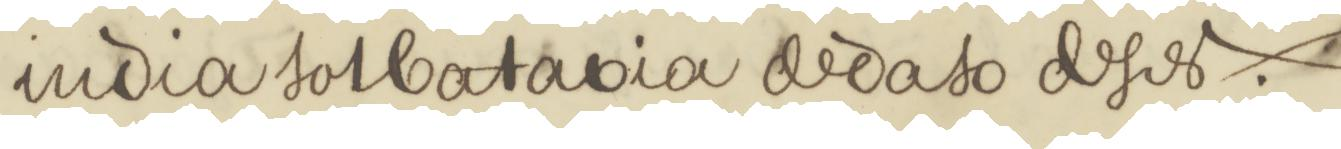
india tot batavia de dato deses.
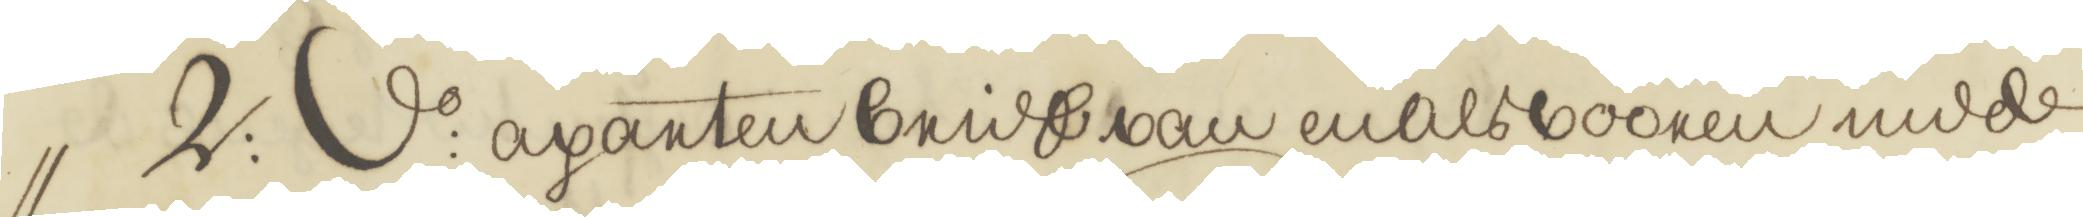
„ 2. D:o aparten brief van en als vooren mede
